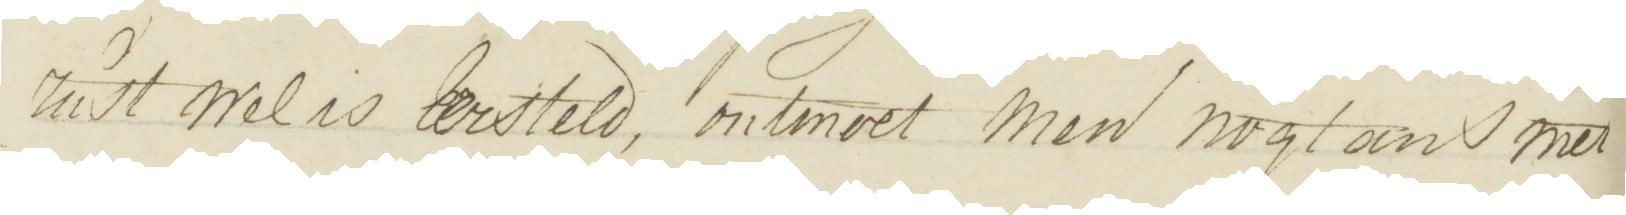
rust wel is hersteld, ontmoet men nogtans met
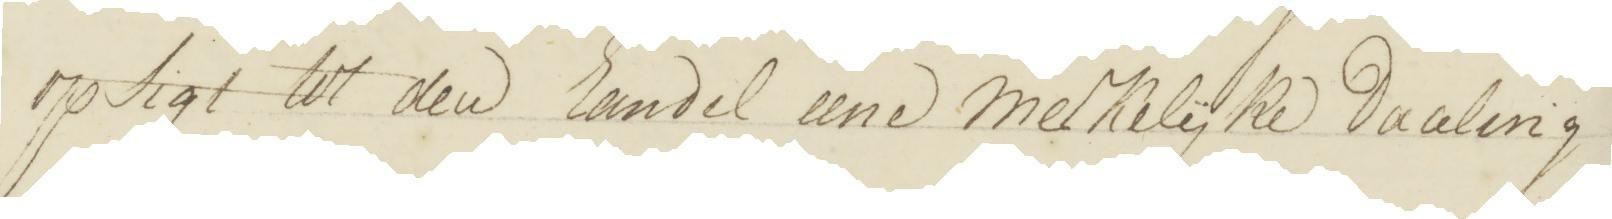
op sigt tot den handel eene merkelijke daaling
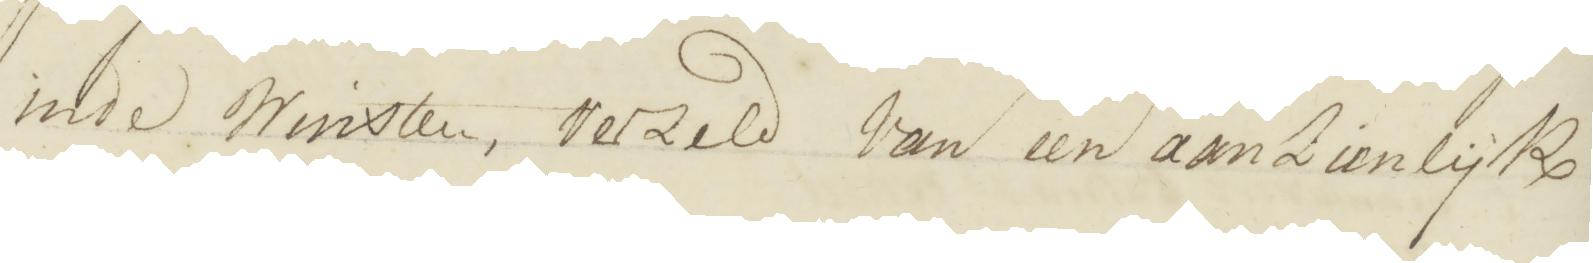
inde winsten, verzeld van een aanzienlijk
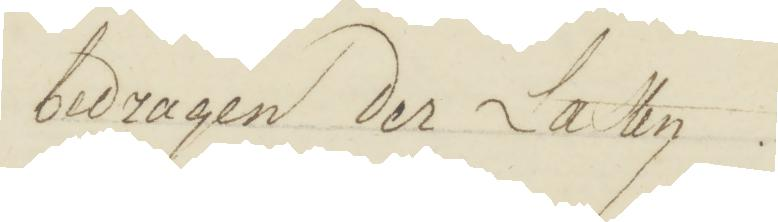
bedragen der Lasten.
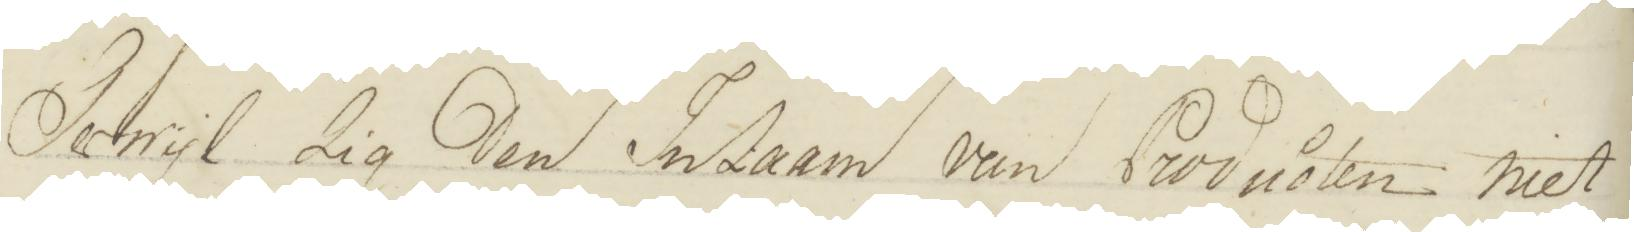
Terwijl zig den Inzaam van Producten niet
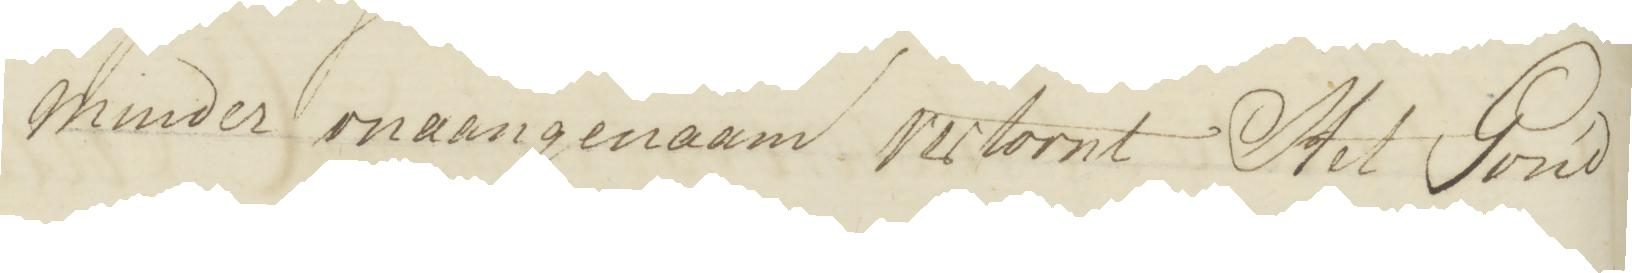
minder onaangenaam vertoont Het Goud
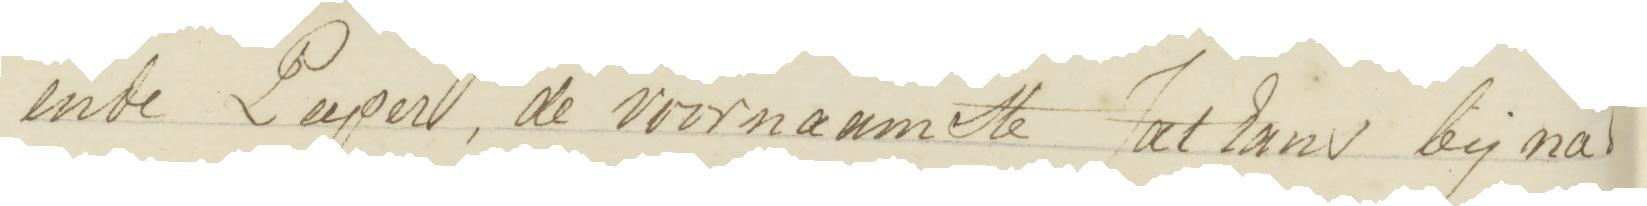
ende Peeper, de voornaamste Jathans bij na
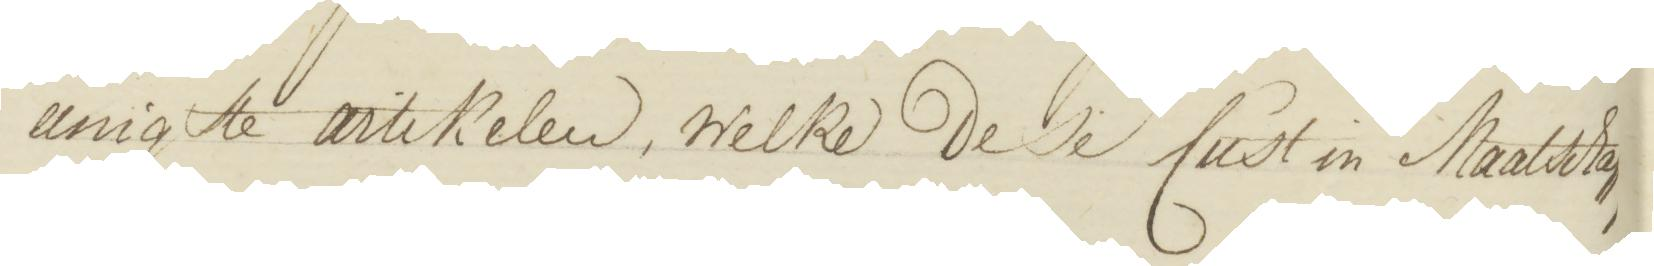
eenigste artikelen, welke dese Cust in Maatscha
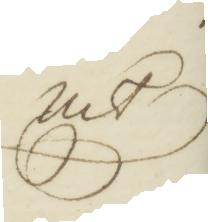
uit
